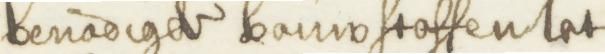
benodigde bouwstoffen tot
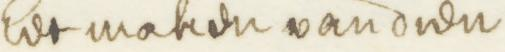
het maken van dien
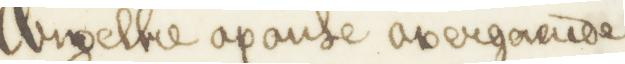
dewelke op onse overgaende
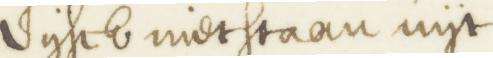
Eijsch niet staan uijt
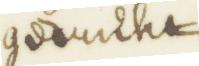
gedrukt
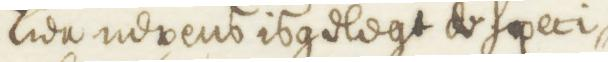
hier nevens is gelegt de speci„
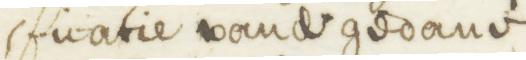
,ficatie van de gedane
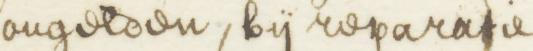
ongelden, bij reparatie
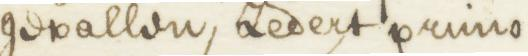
gevallen, zedert primo
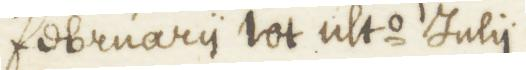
februarij tot ult=o Iulij
